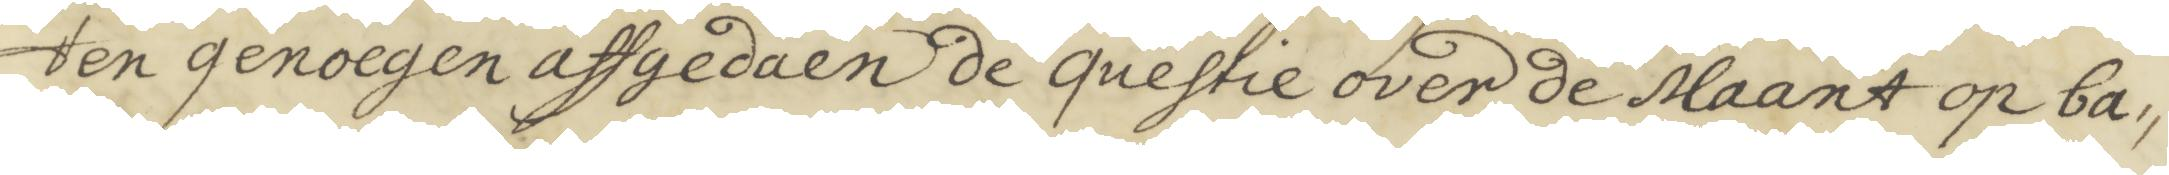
ten genoegen affgedaen de questie over de Maant op ba„
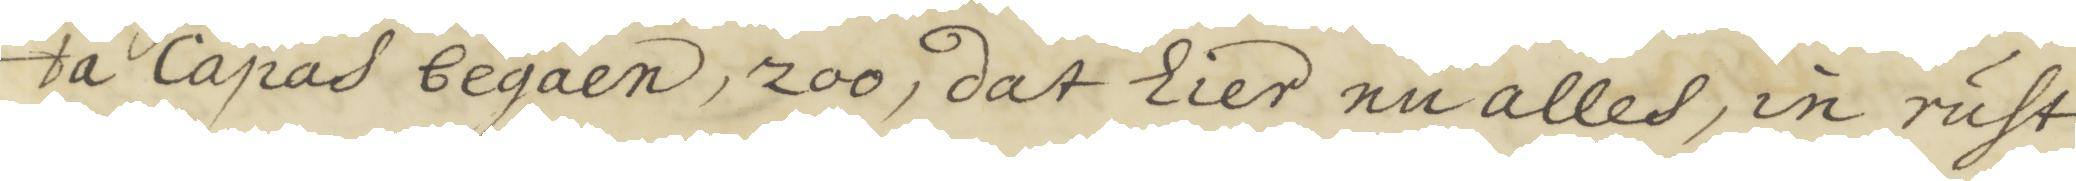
ta Capas begaen, zoo, dat hier nu alles, in rust,
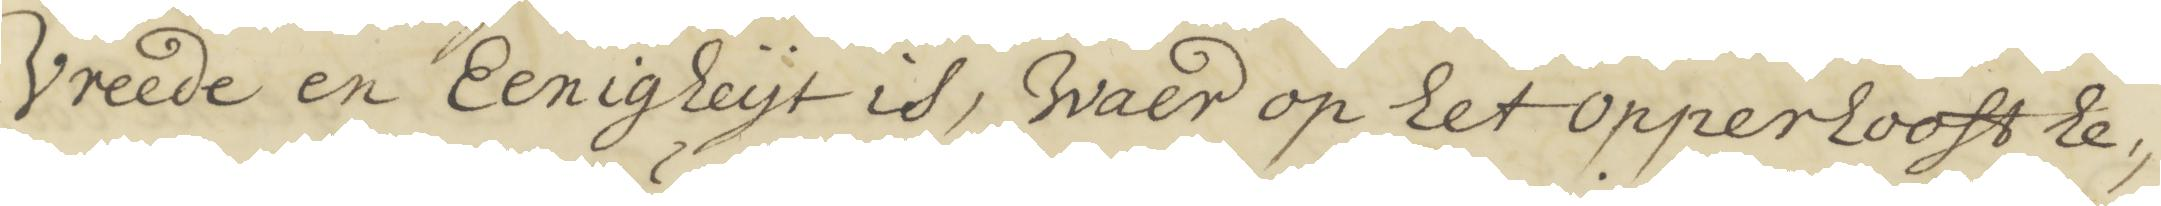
Vreede en Eenigheijt is, waer op het opperhooft he„
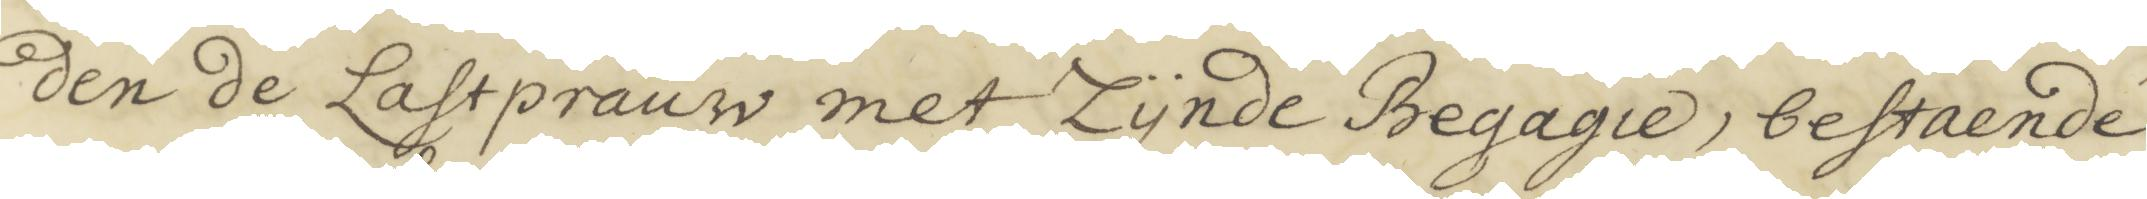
den de Lastprauw met zijnde Begagie, bestaende
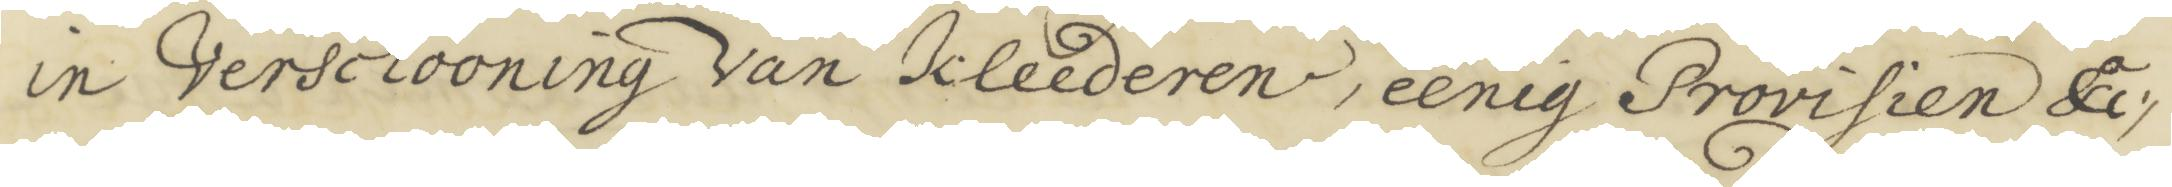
in verschooning van kleederen, eenig Provisien &ca„
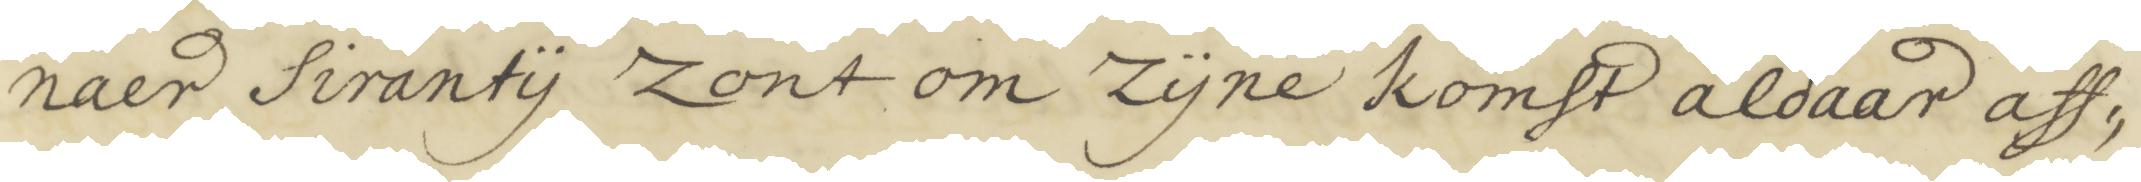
naer Sirantij zont om zijne komst aldaar aff„
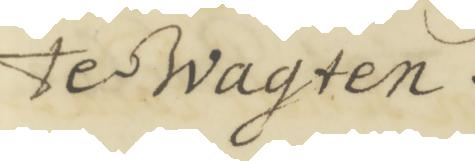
te wagten.
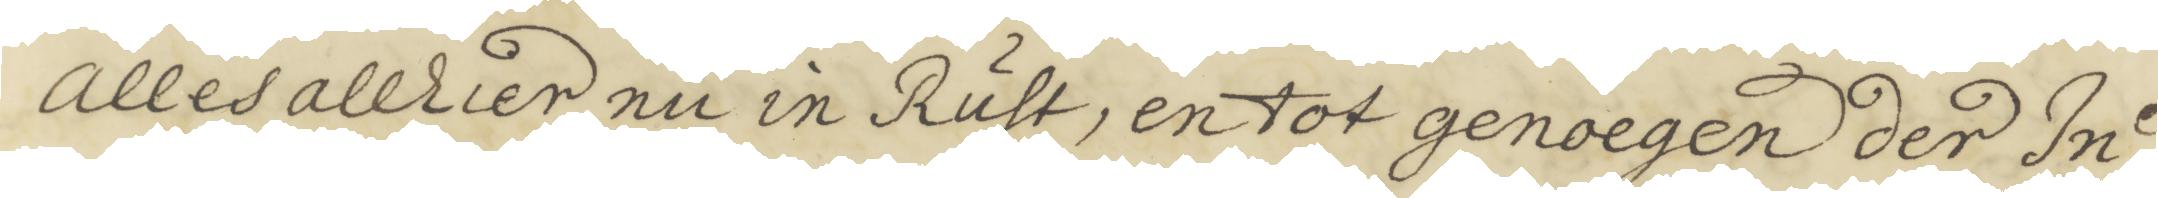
alles allhier nu in Rust, en tot genoegen der In
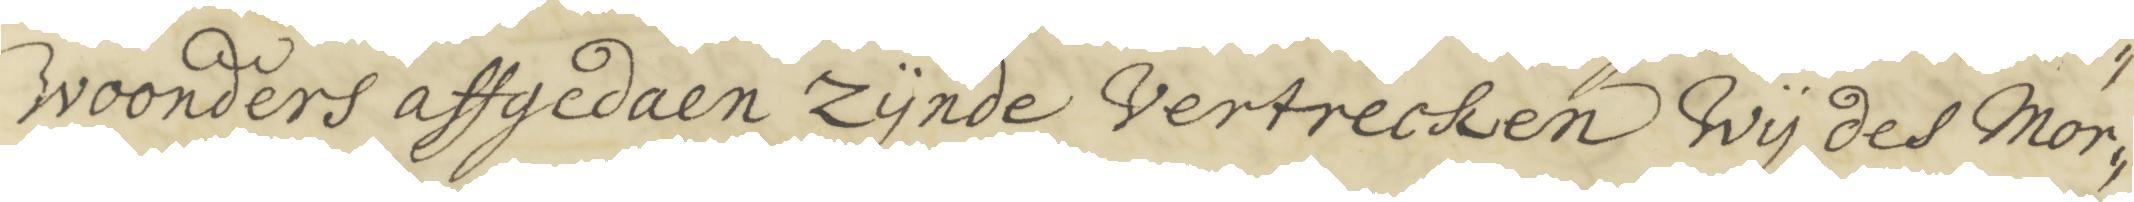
woonders affgedaen zijnde vertrecken wij des mor„
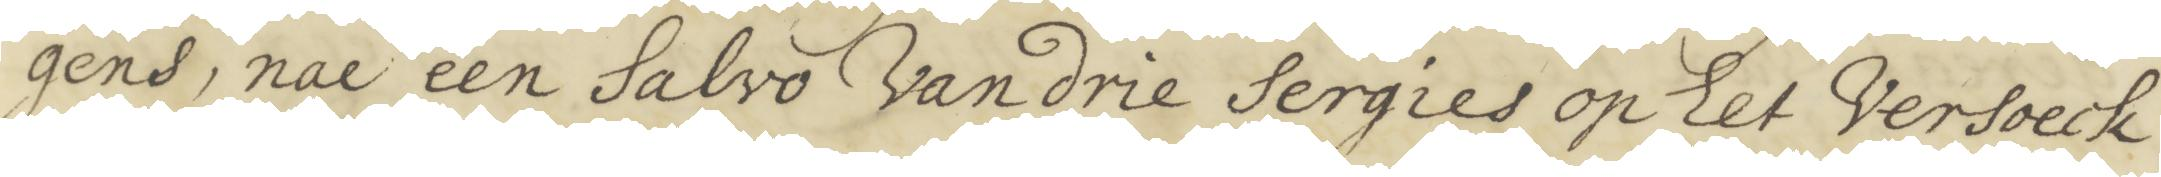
gens, nae een salvo van drie sergies op het versoeck
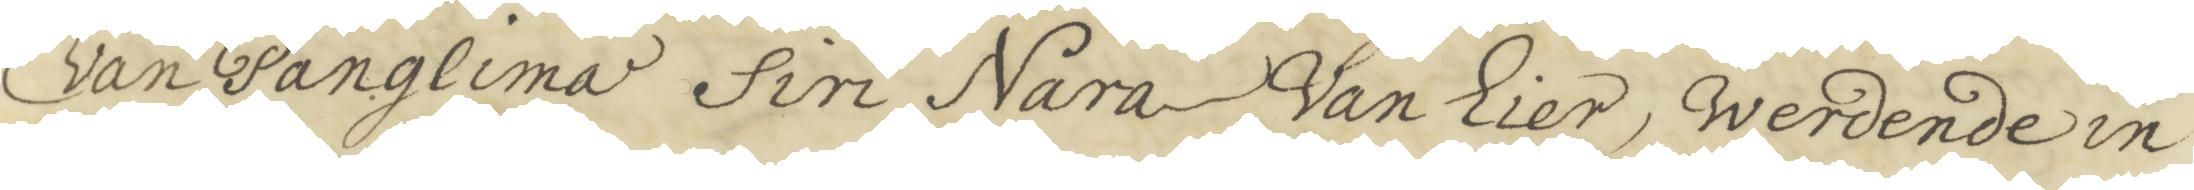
Van „ Panglima Siri Nara van hier, werdende in
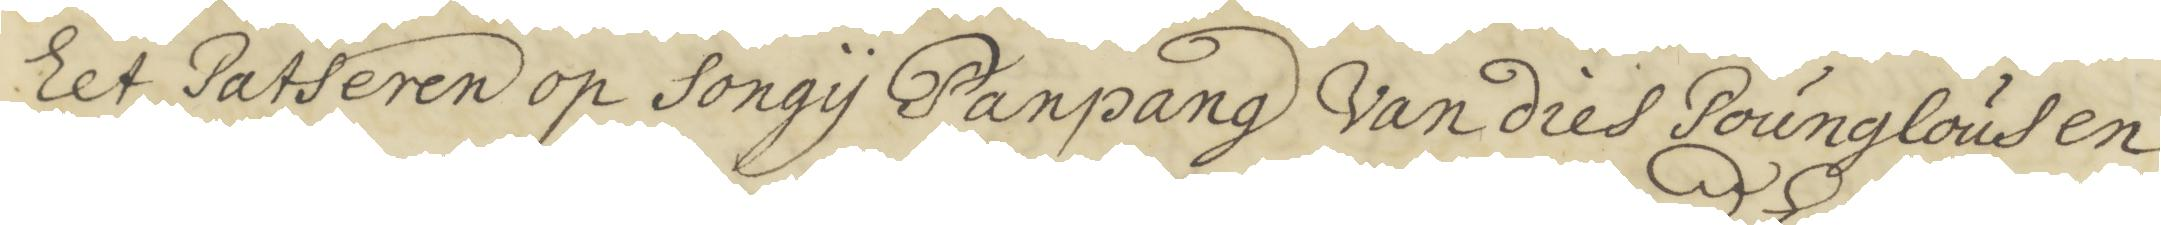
het patseren op songij Panpang van dies Pounglous en
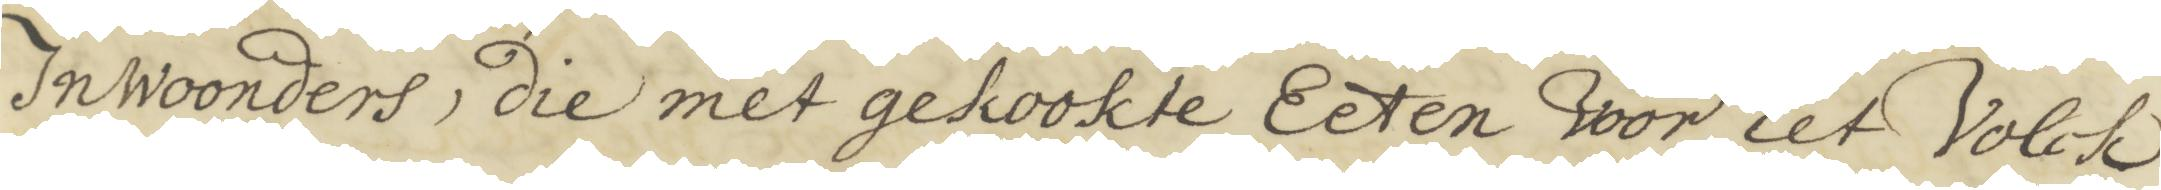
Inwoonders, die met gekookte Eeten voor het Volck
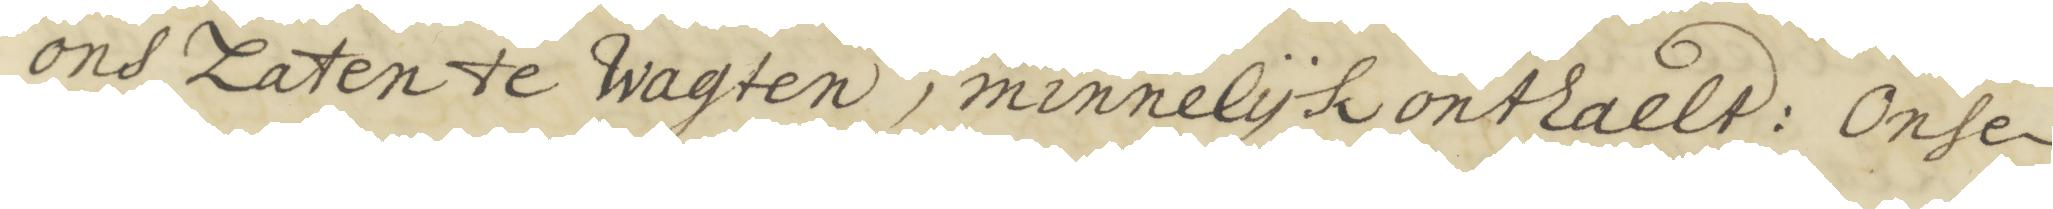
ons zaten te wagten, minnelijk onthaelt: Onse
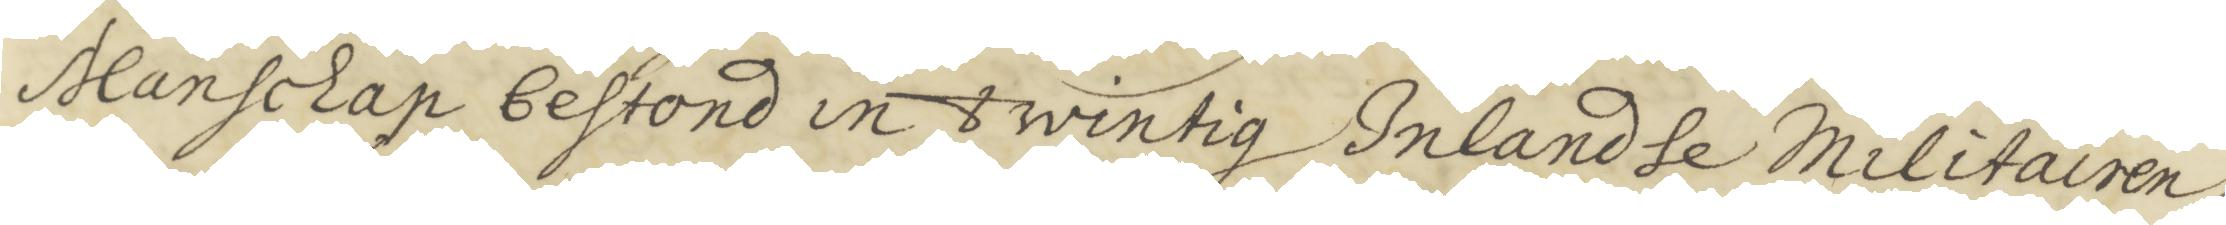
Manschap bestond in twintig Inlandse militairen,
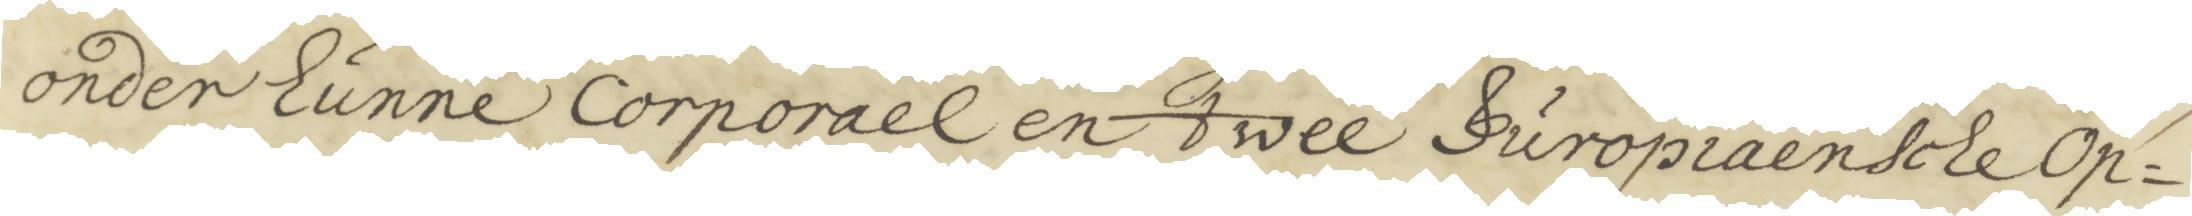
onder hunne corporael en twee Europiaensche op=
